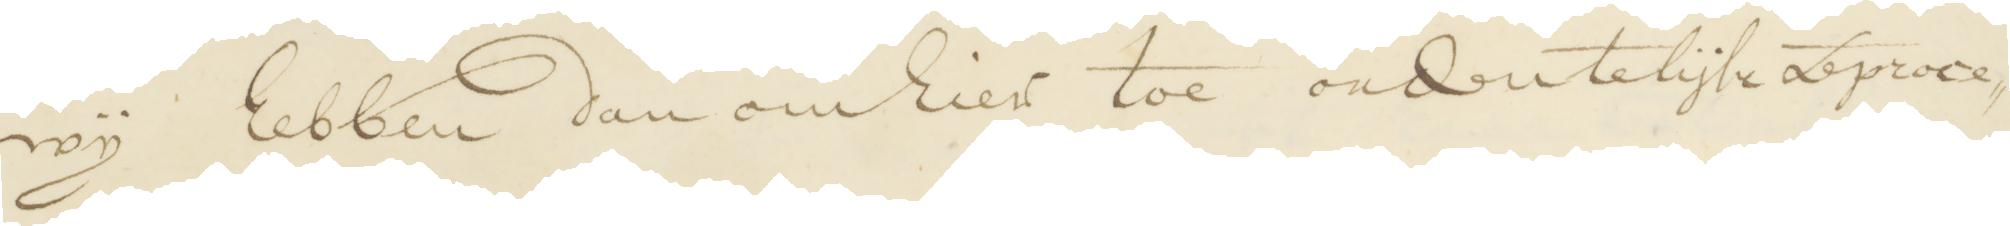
wij hebben dan om hier toe ordentelijk te proce„
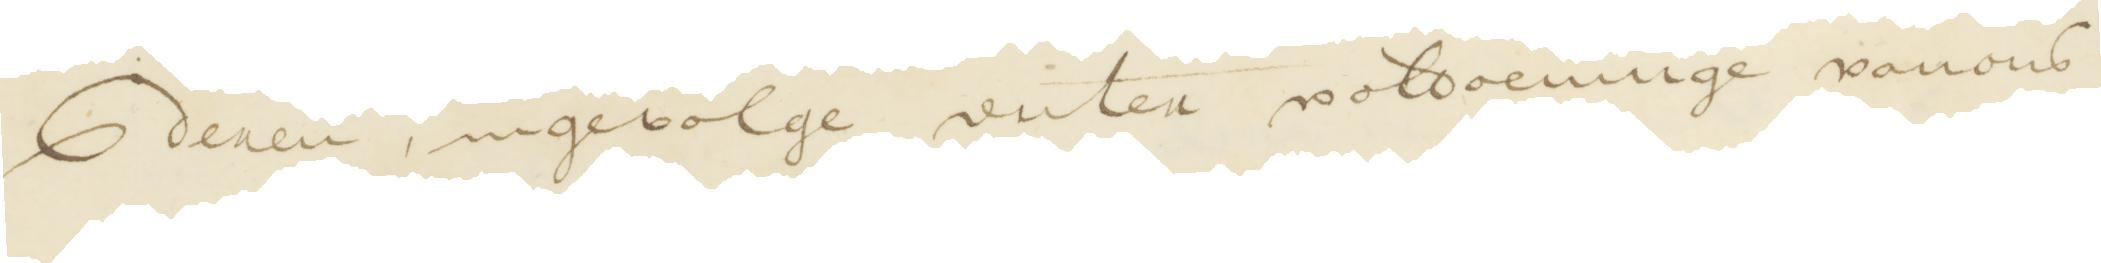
deren, ingevolge en ter voldoeninge van ons
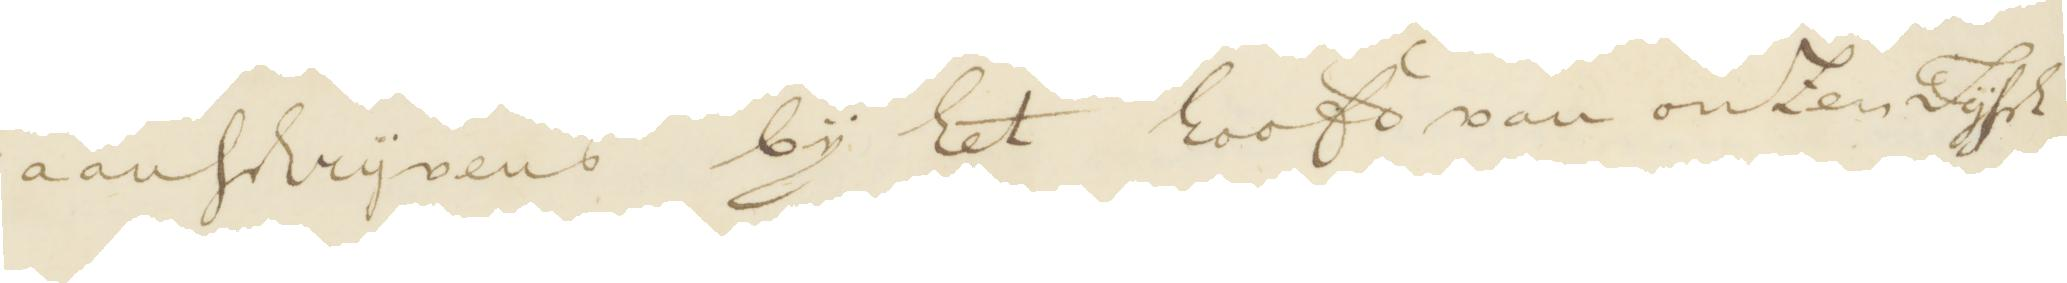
aanschrijvens bij het hoofd van onzen Eijsch
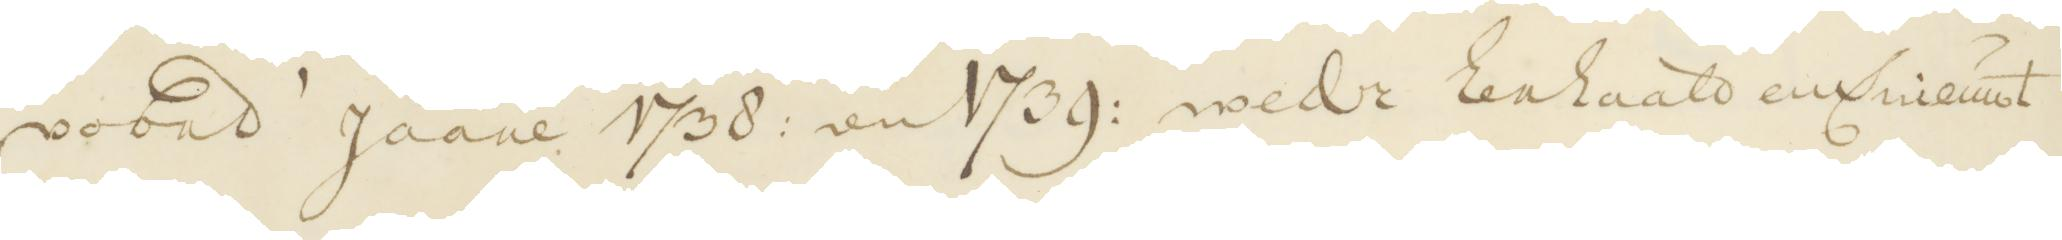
voor d’ Jaare 1738: en 1739: weder herhaald en vernieuwt
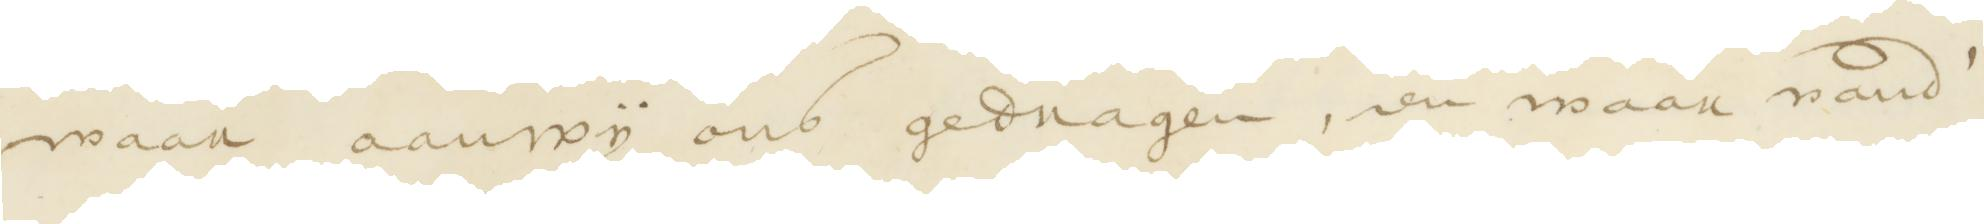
waar aan wij ons gedragen, en waar van d'
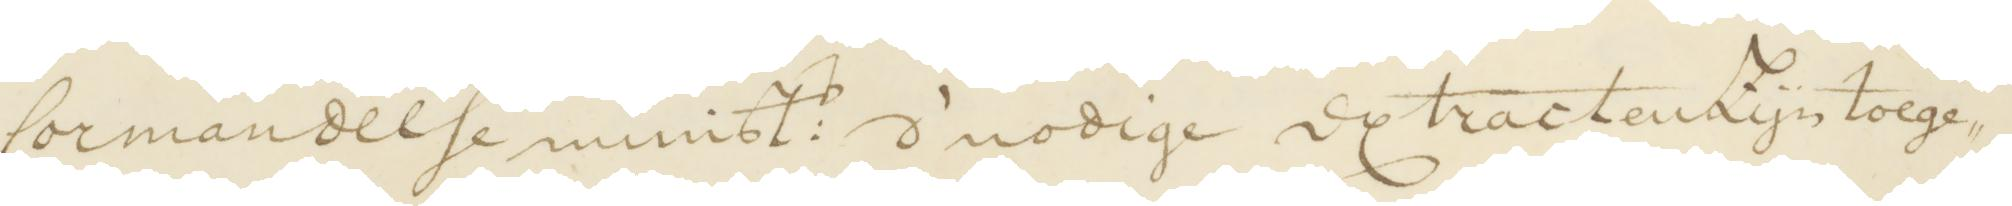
Cormandelse minist:s d’nodige extracten Zijn toege„
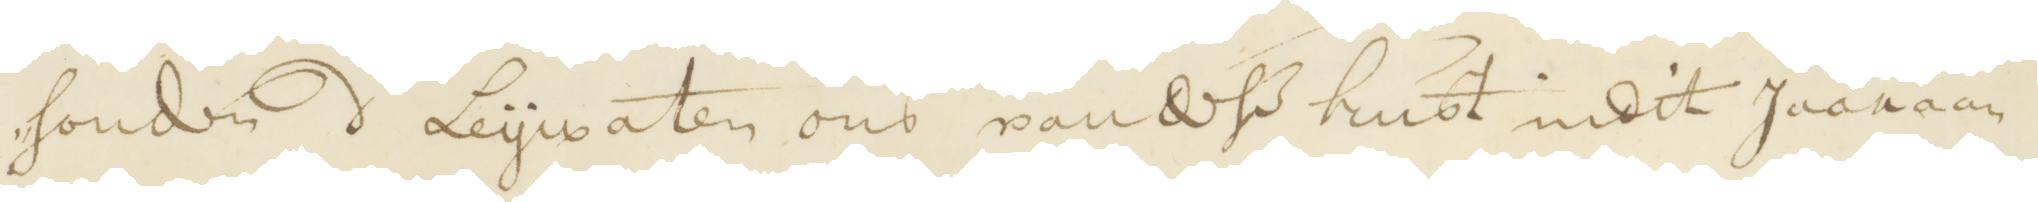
„sonden d' Leijwaten ons van dese kust in dit Jaar aan
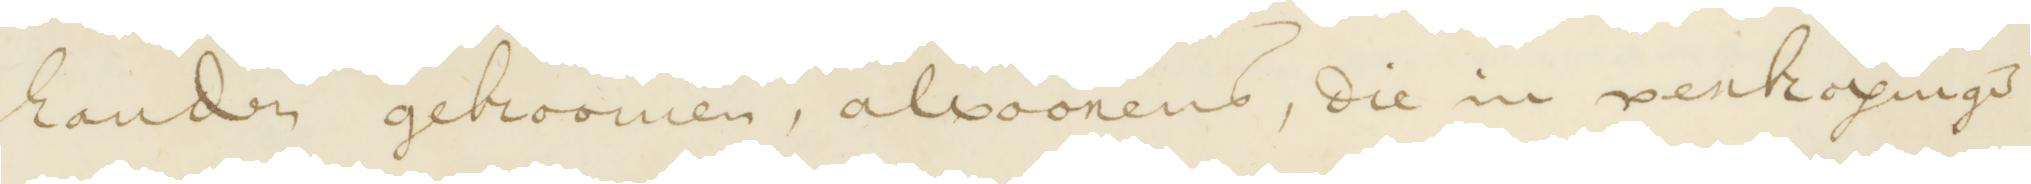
handen gekoomen, alvoorens, die in verkopinge
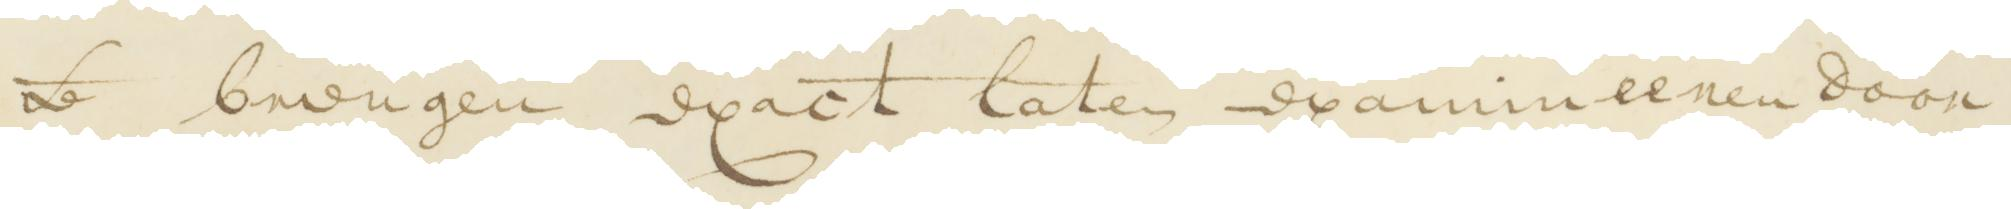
te brengen exact laten examineeren door
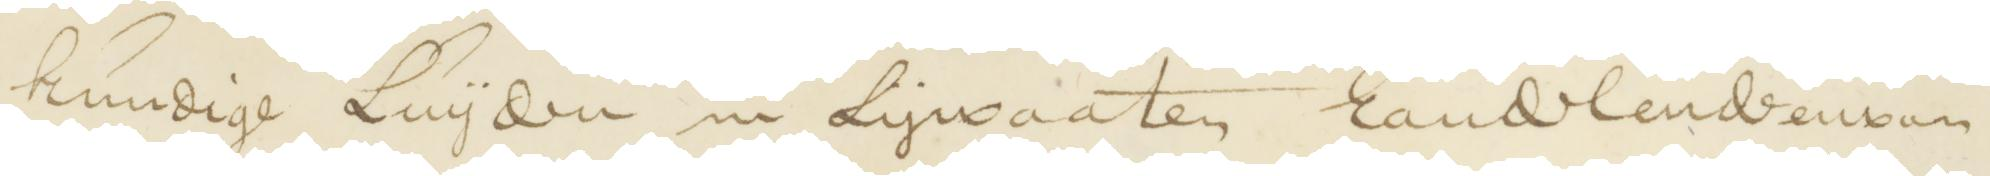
kundige Luijden in Lijwaaten handelende en van
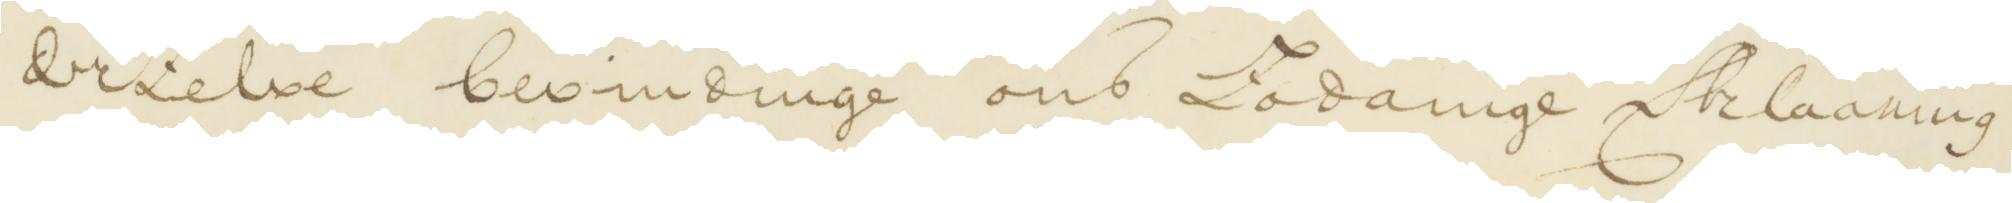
derzelve bevindinge ons Zodanige verklaaring
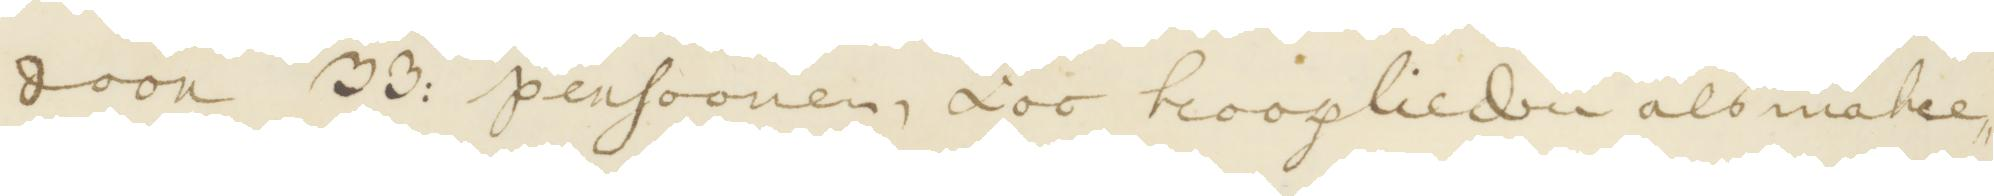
door 33: persoonen, zoo kooplieden als make„
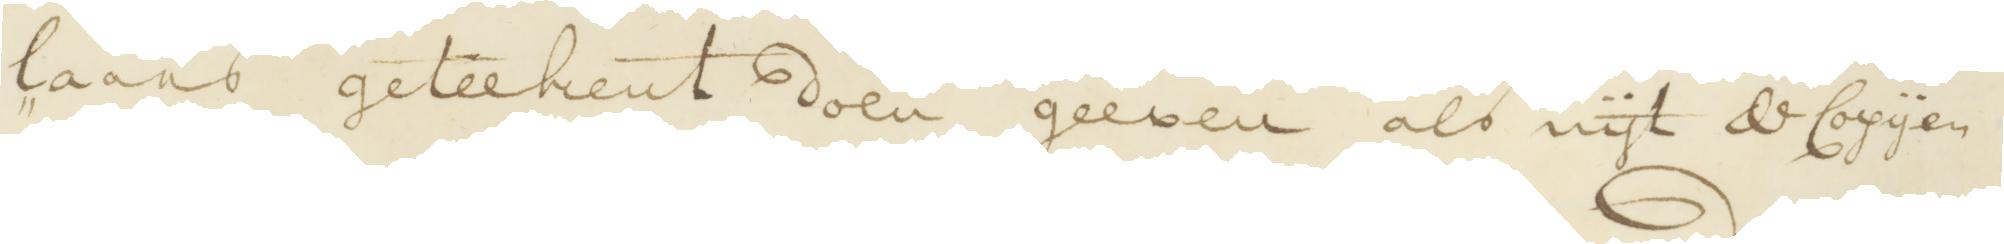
„laars geteekent doen geeven als uijt de Copijen
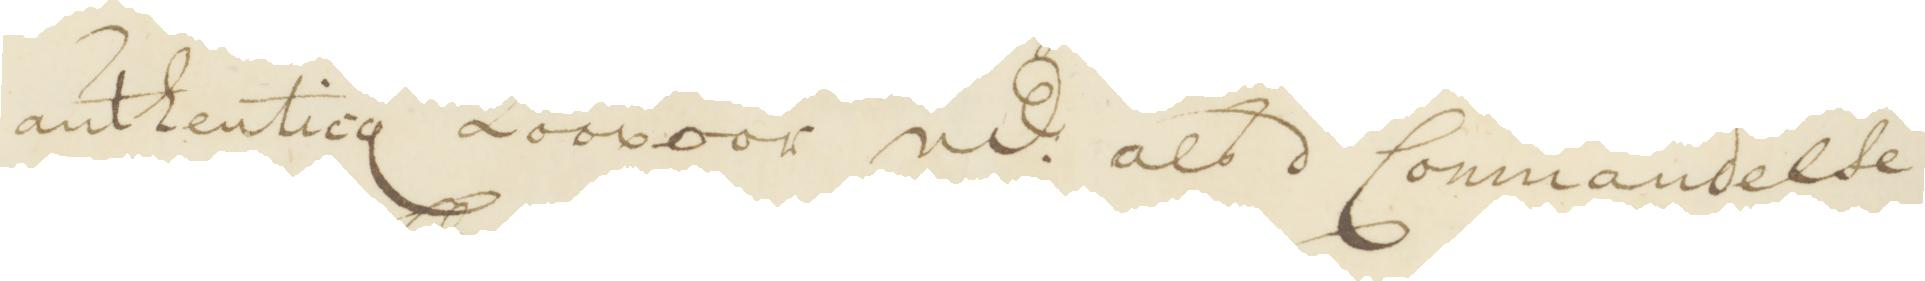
authenticq Zoo voor uE: als d' Cormandelse
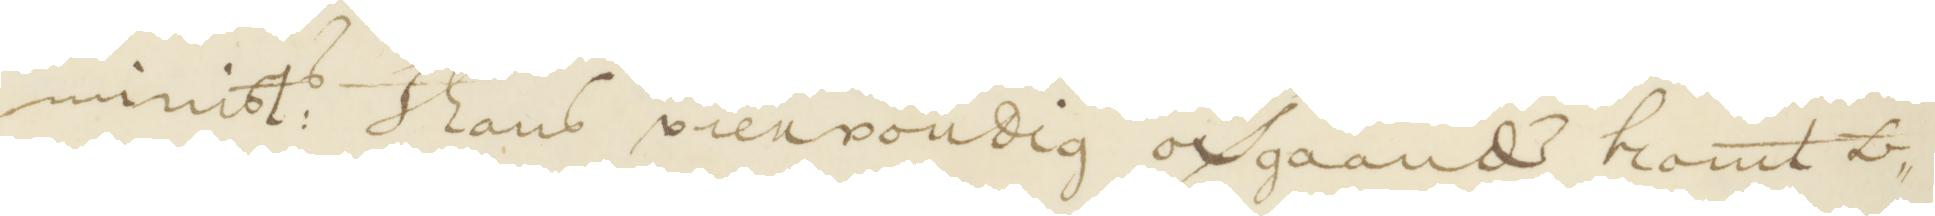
minist:s thans viervoudig overgaande komt te„
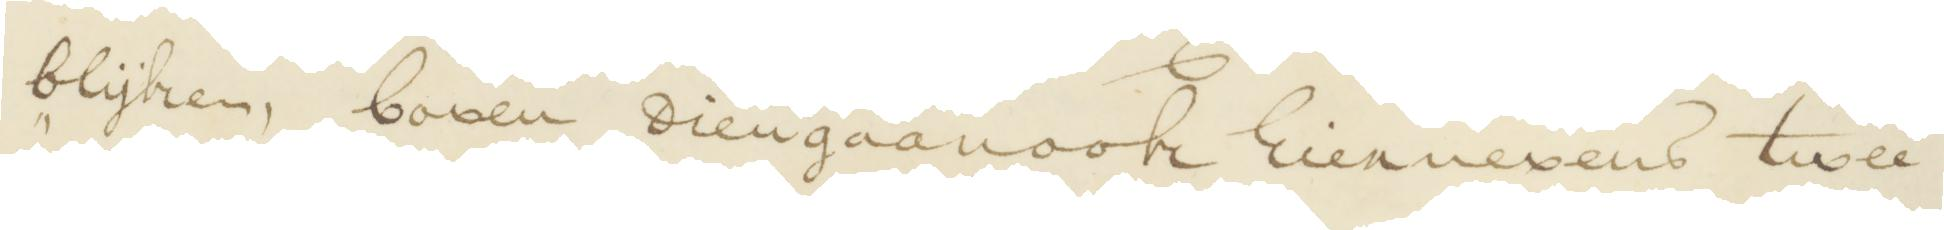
„blijken, bovendien gaan ook hier nevens twee
